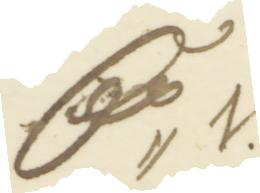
P„a 1
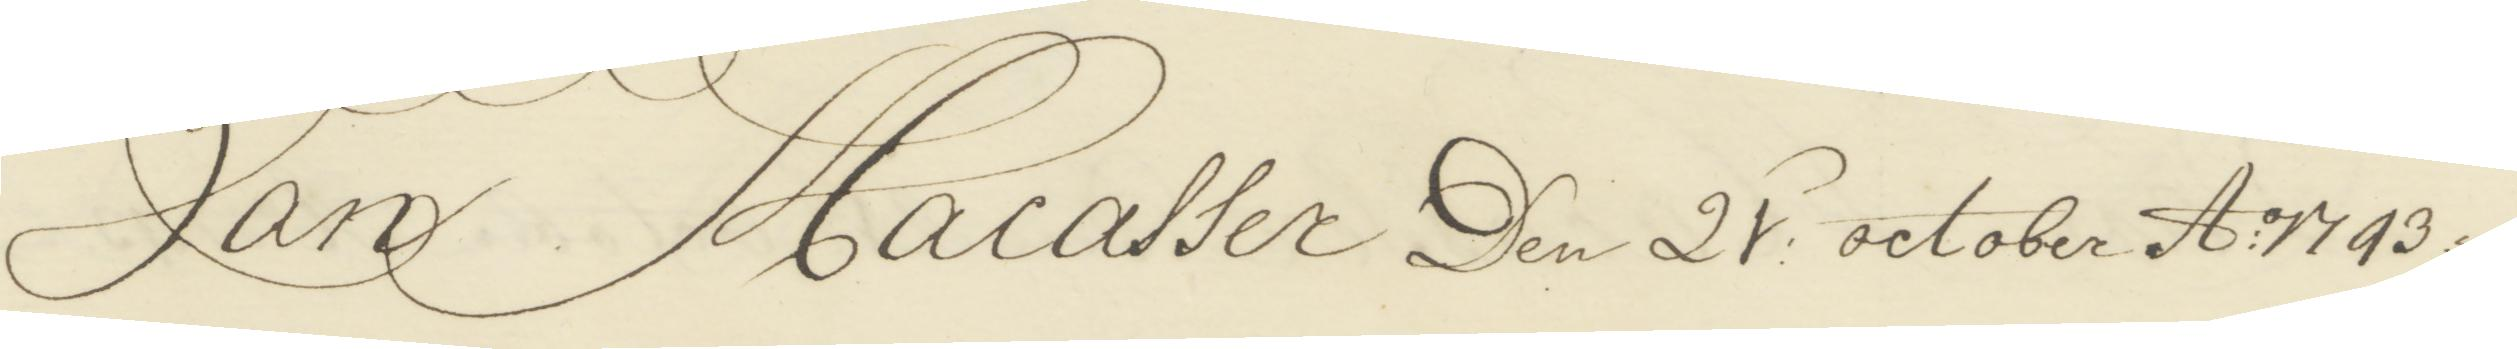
Van Macasser Den 21:' october A:o 1743.-.
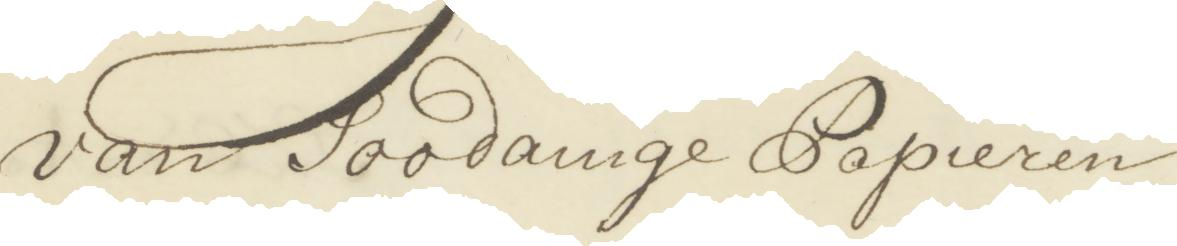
van soodanige Papieren
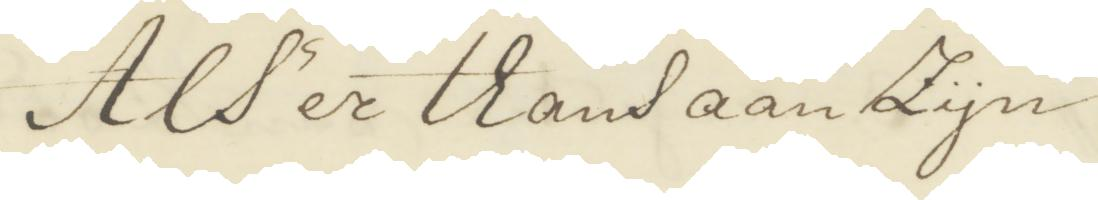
Als' er thans aan zijn
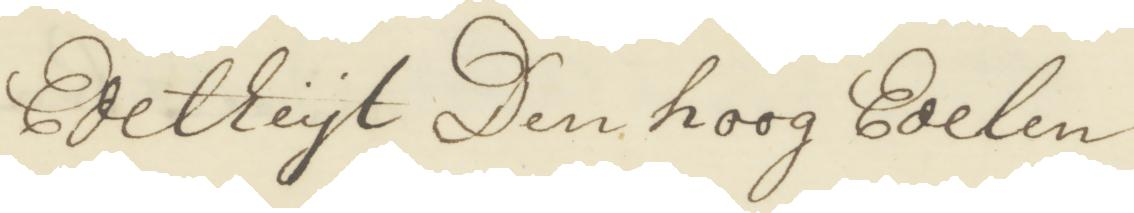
Edelheijt Den hoog Edelen
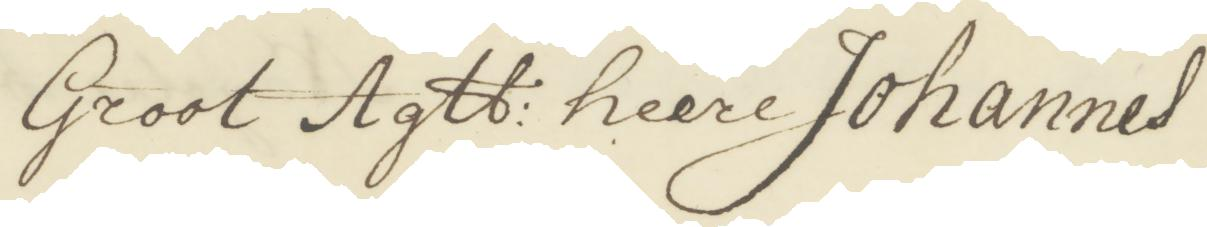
Groot Agtb: heere Johannes
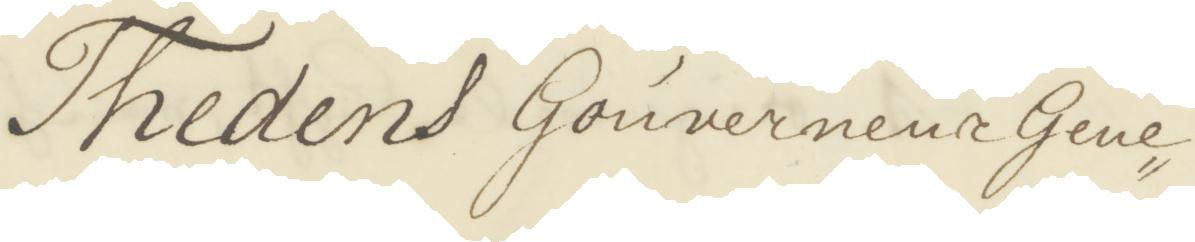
Thedens Gouverneur Gene„
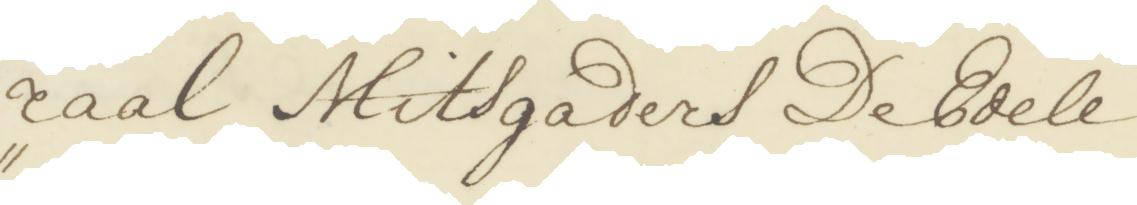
„raal, Mitsgaders De Edele
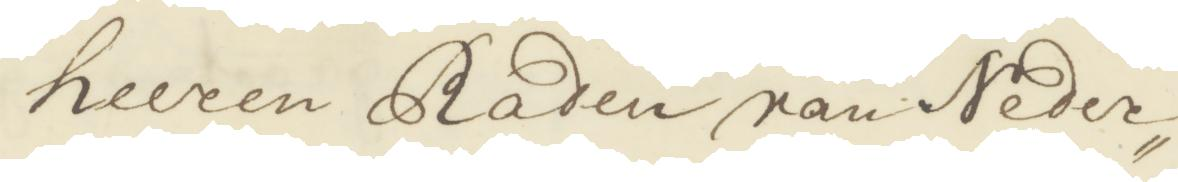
heeren Raden van Neder„
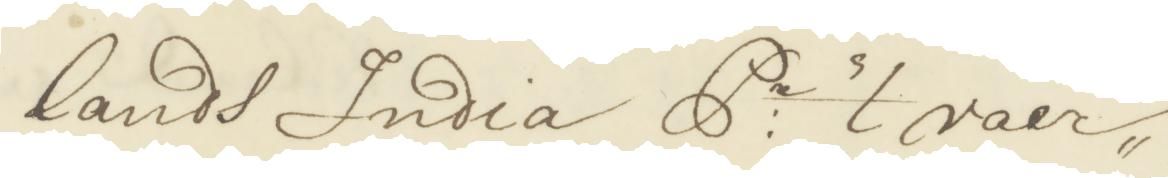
lands India P:r ’t vaer„
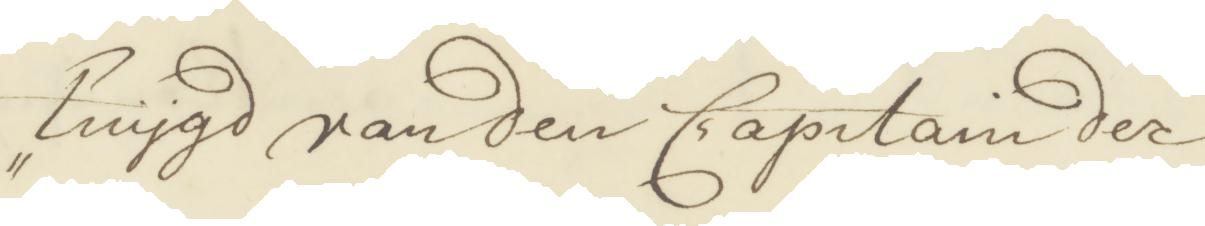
„tuijgd van den Capitain der
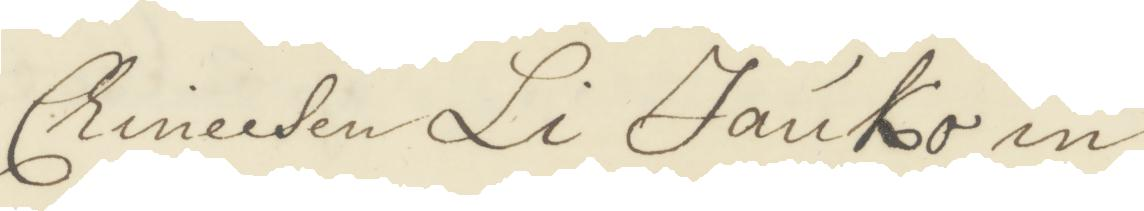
Chineesen Li Iauko in
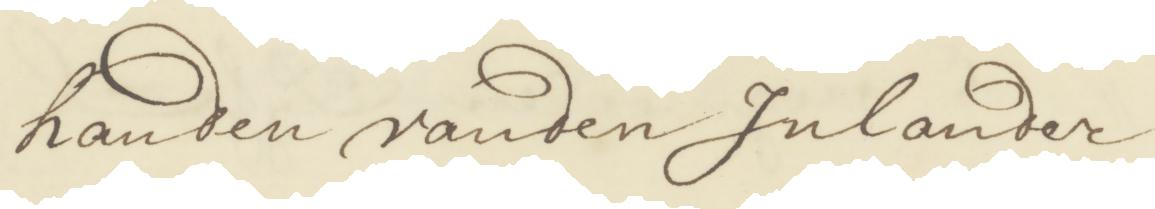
handen van den Jnlander
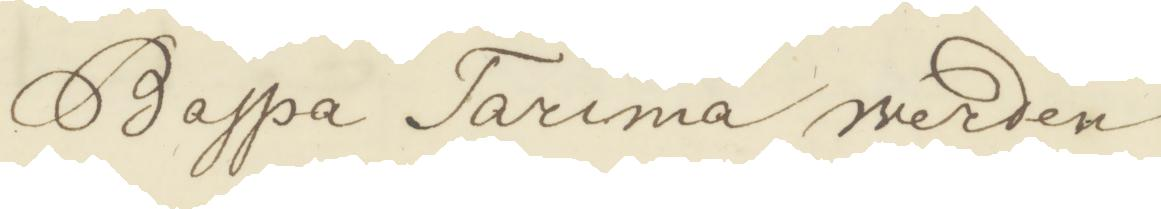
Bappa Tarima werden
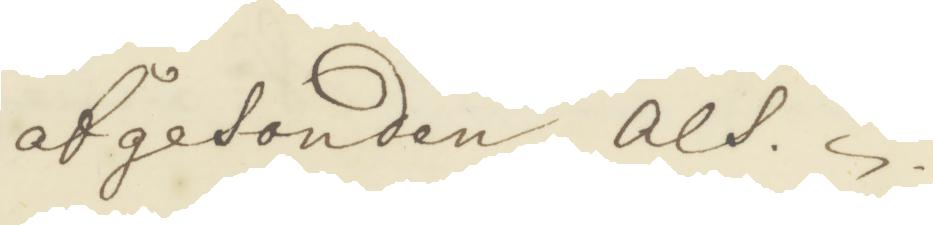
afgesonden, als.—.
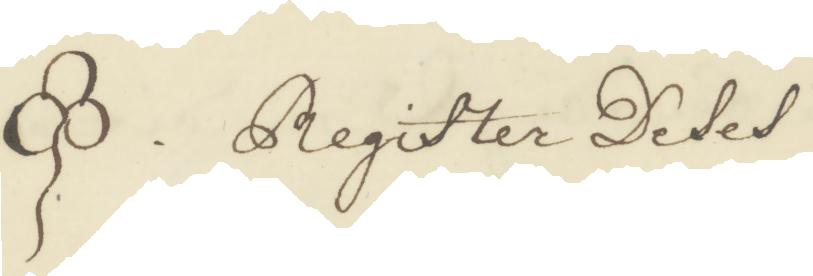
Register Deses
